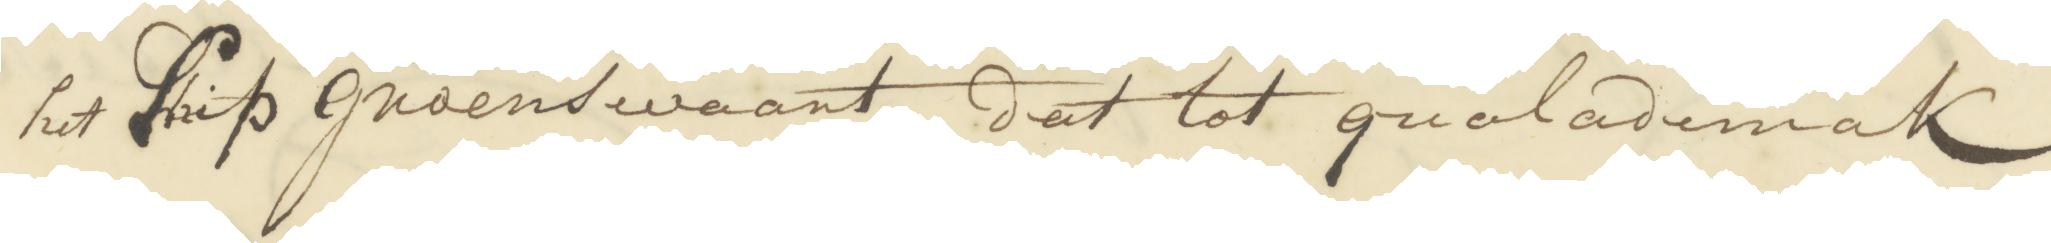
het schip groenswaart dat tot quolademak
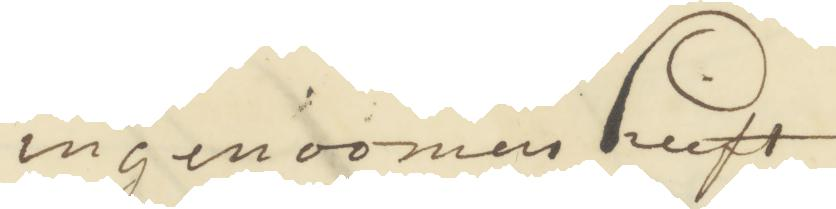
ingenoomen heeft
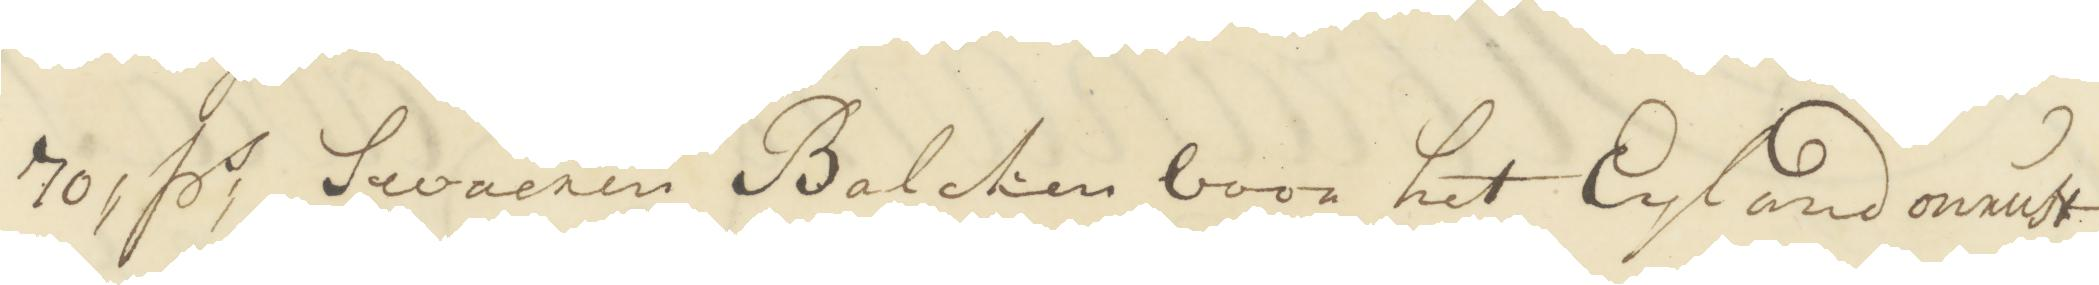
70„ p„s swaeren Balcken voor het Eyland onrust
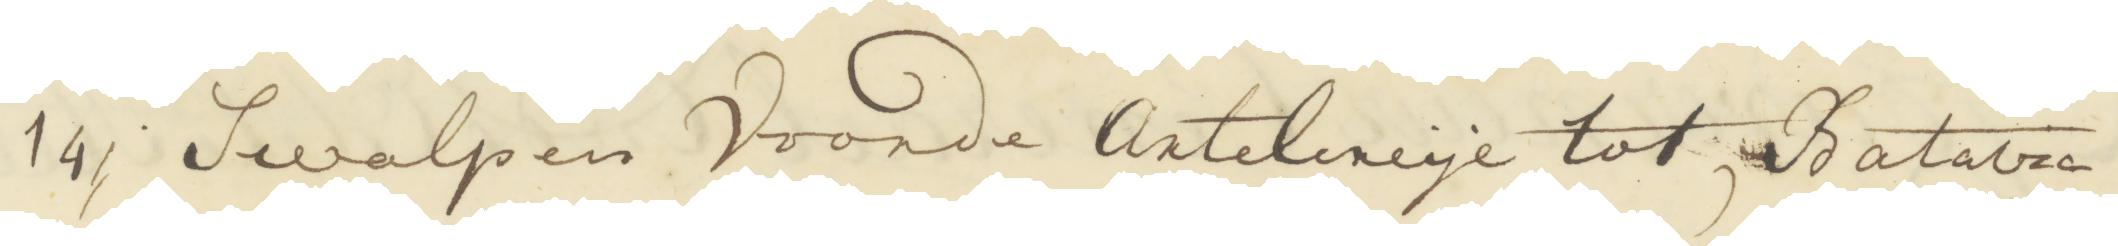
14„ swalpen voorde artelereije tot Batavia
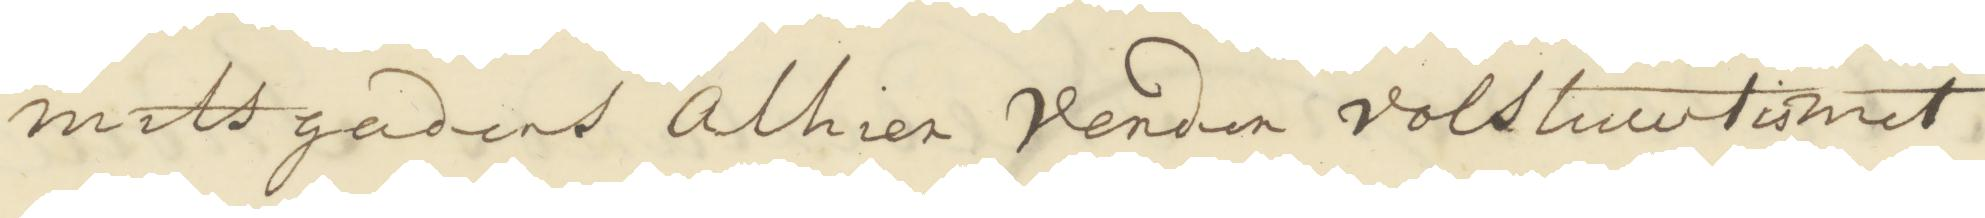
mitsgaders alhier verder volstuwt is met
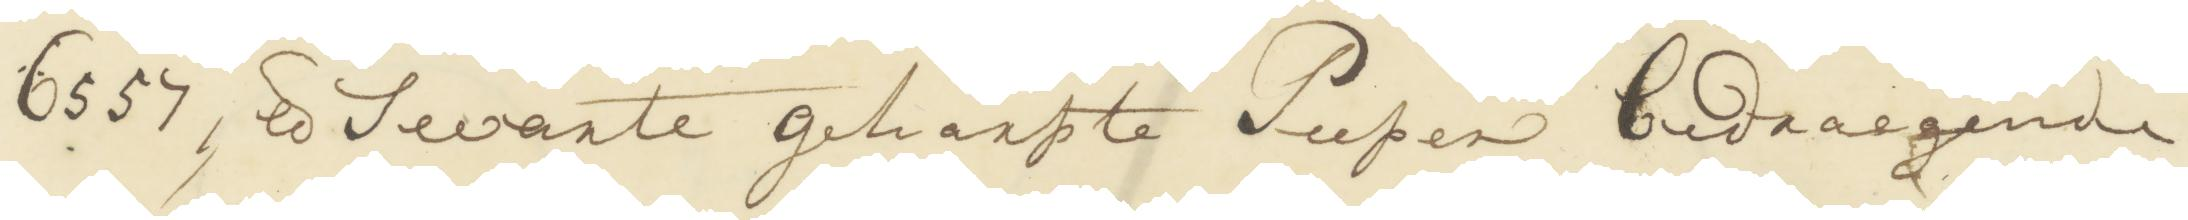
6557„ lb swarte geharpte Peper bedraegende
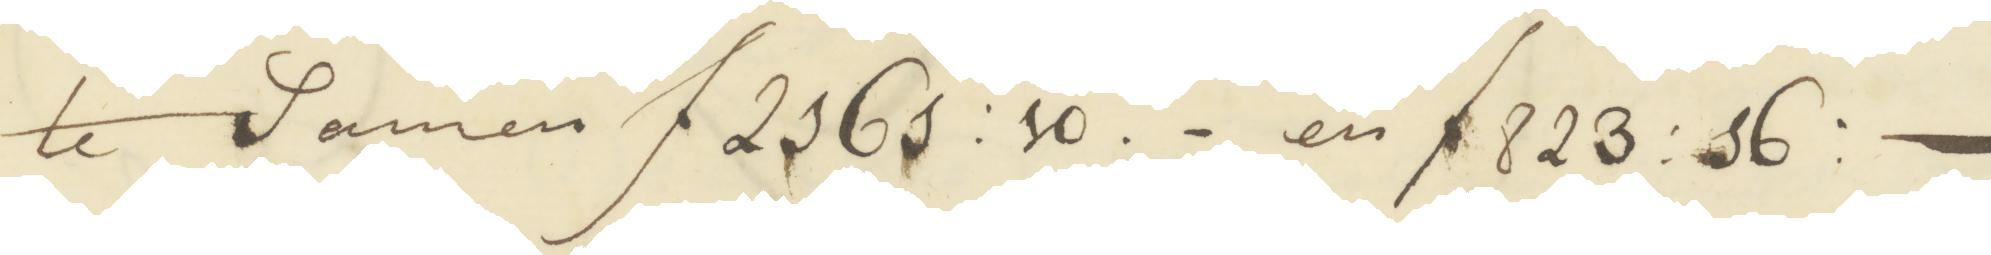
te samen ƒ 2161 : 10 : — en ƒ 823: 16: —
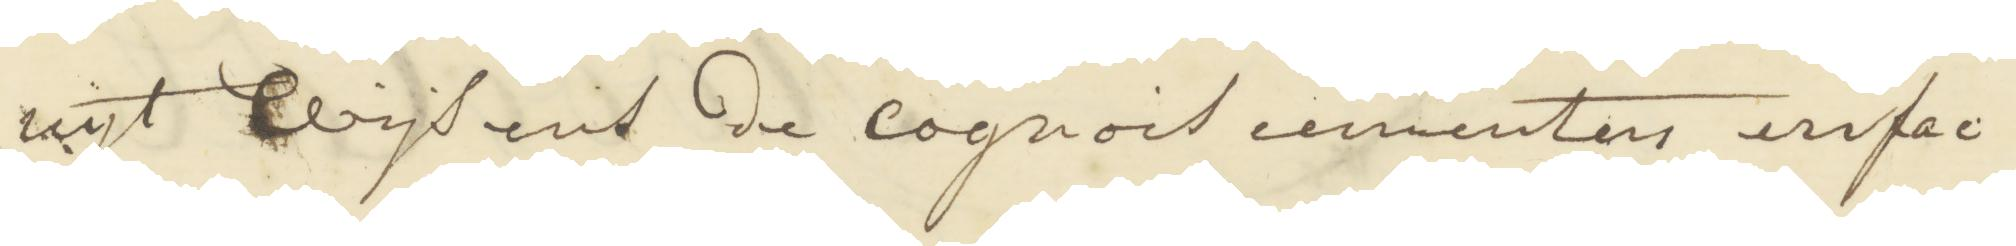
uijt wijs ent de cognoiscementen en fac
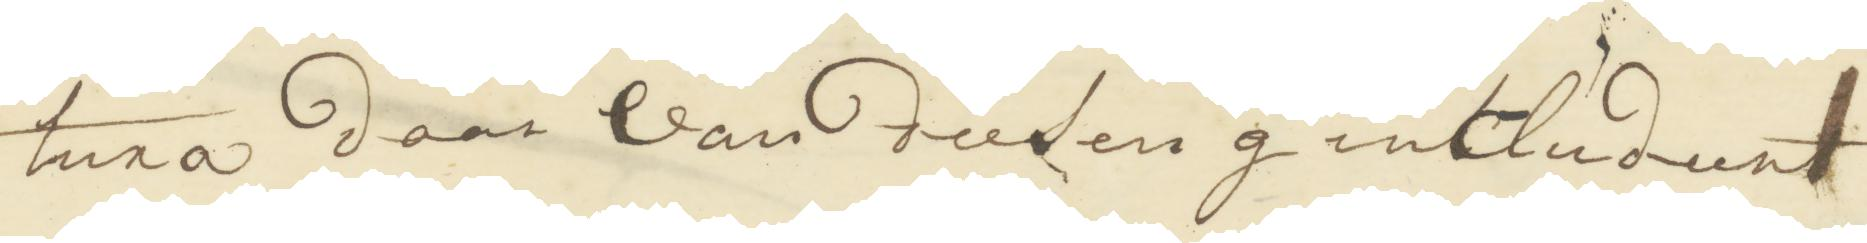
tura daar van deesen g includeert
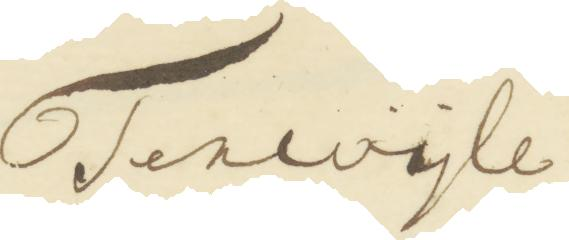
Terwijle
